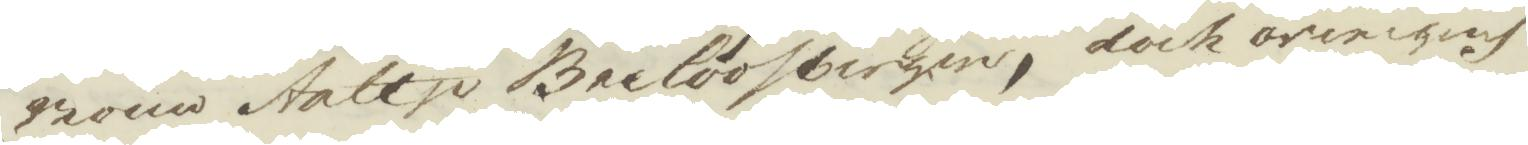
vrouw Aaltje Breloosbergen, doch overigens
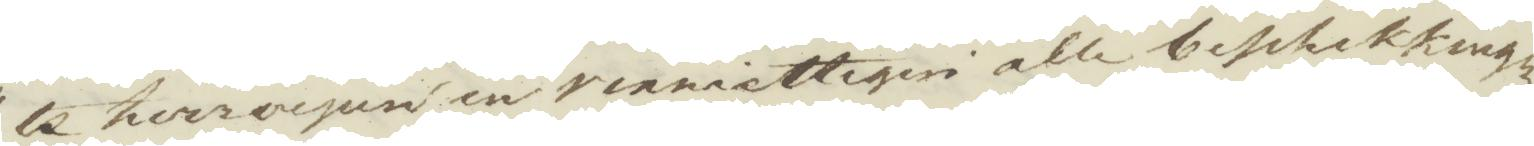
te herroepen en verniettigen alle beschikkingen,
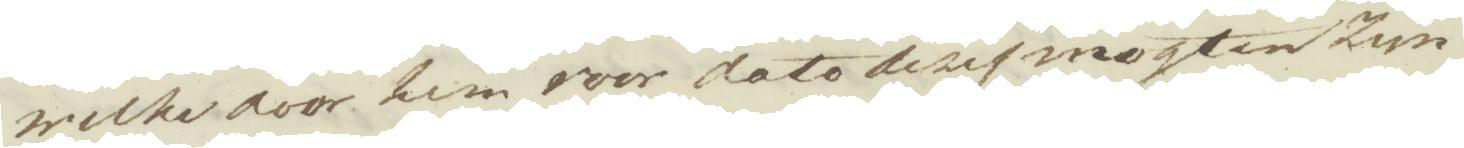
welke door hem voor dato dezes mogten zyn
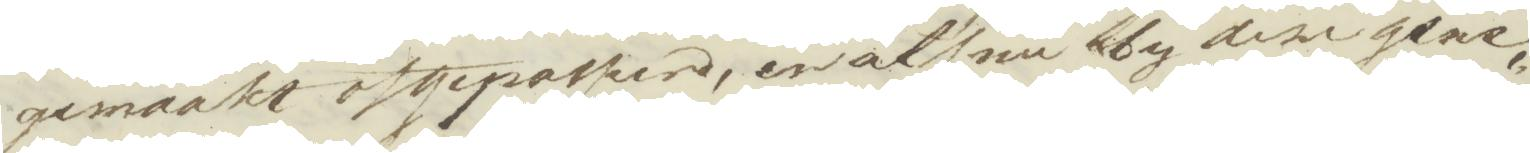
gemaakt of gepasserd, en als nu by deze gene„
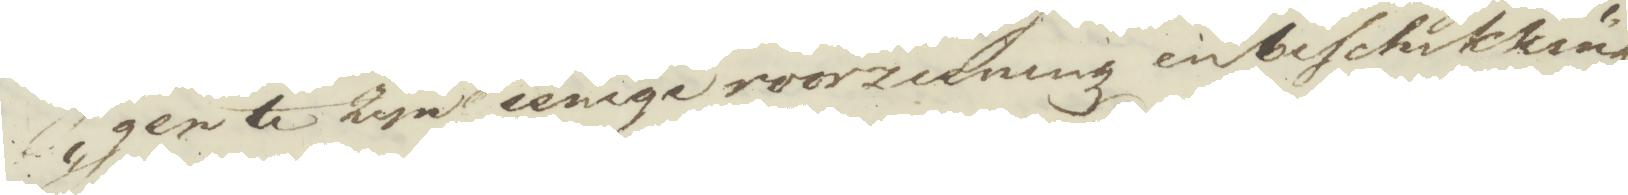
„gen te zyn eenige voorziening en beschikking
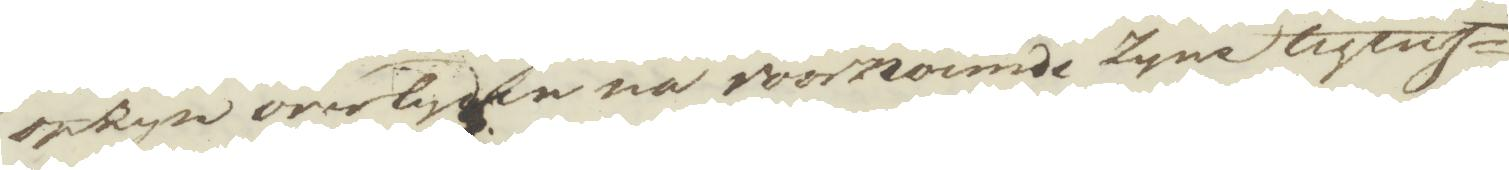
op zyn overlyden na voornoemde zyne tegens=
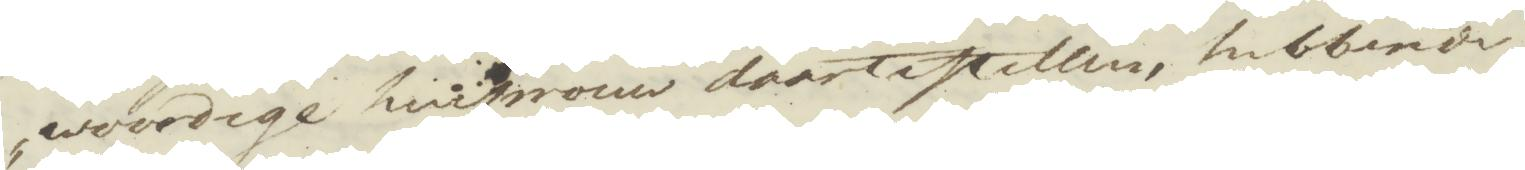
„woordige huisvrouw daartestellen, hebbende
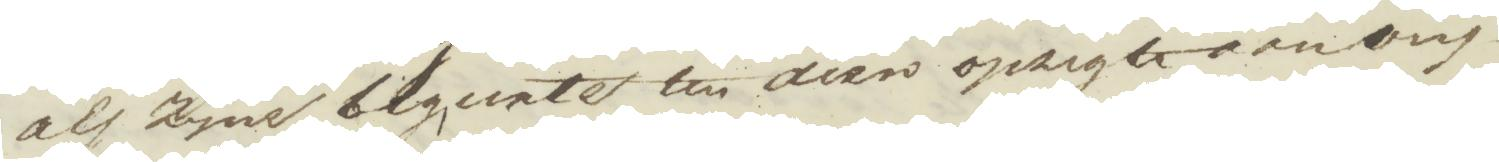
als zyne begeerte ten dien opzigte aan ons
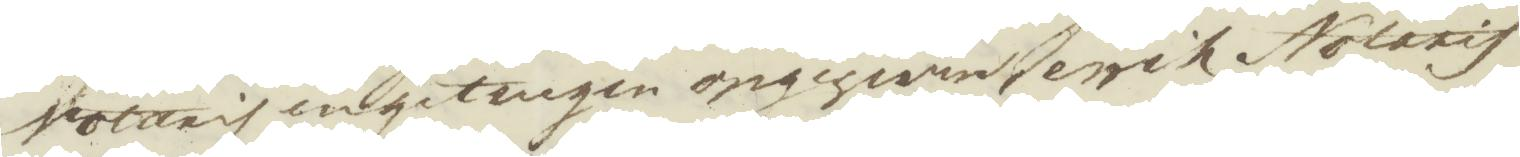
notaris en getuigen opgegeven, en ik Notaris
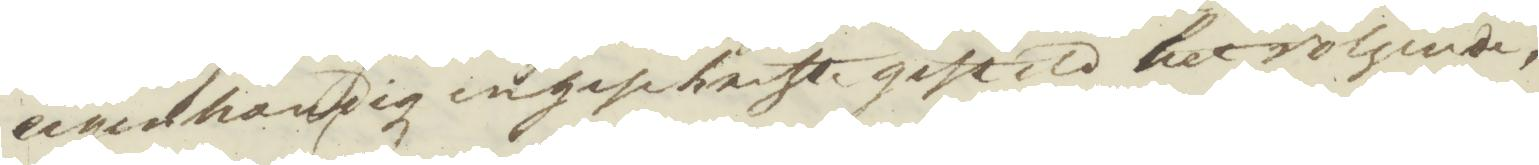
eigenhandig in geschrifte gesteld het volgende,
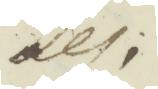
als;
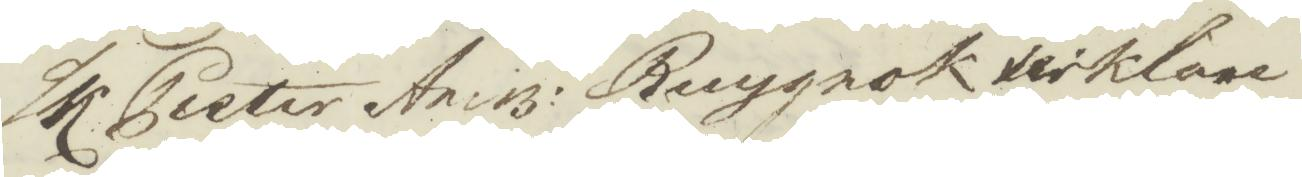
Jk Pieter Aritz: Ruygrok verklare
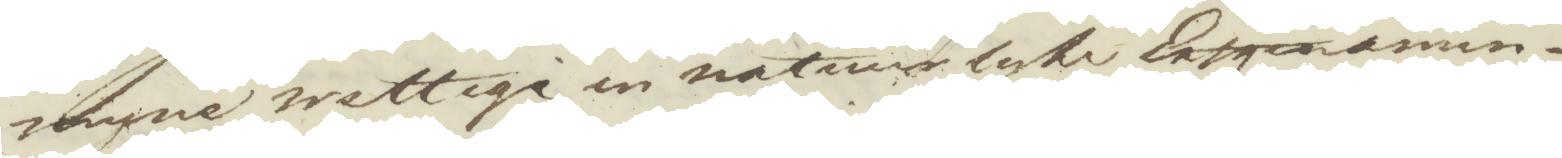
myne wettige en natuurlyke Erfgenamen
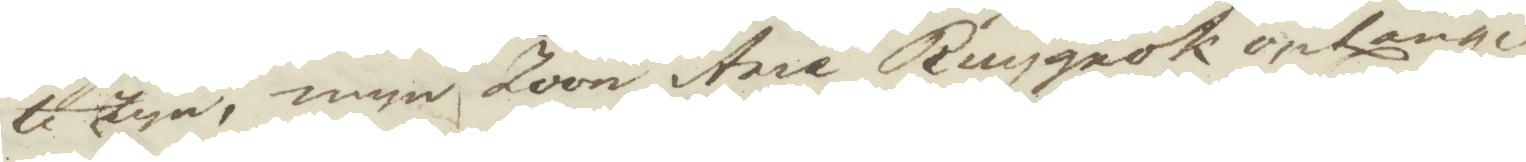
te zyn, myn zoon Arie Ruygrok op Lange
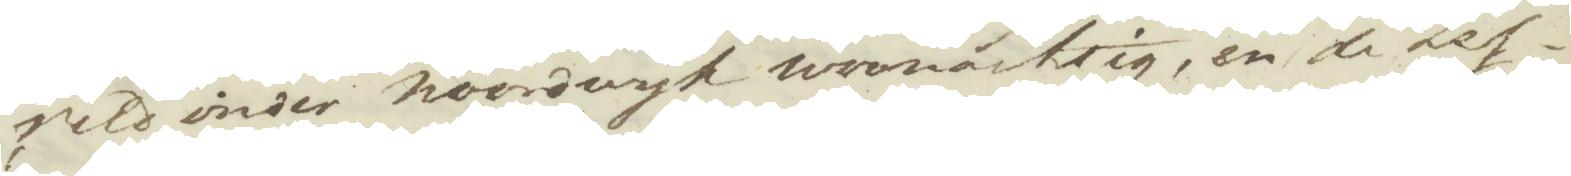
veld onder noordwyk woonachtig, en de zes-
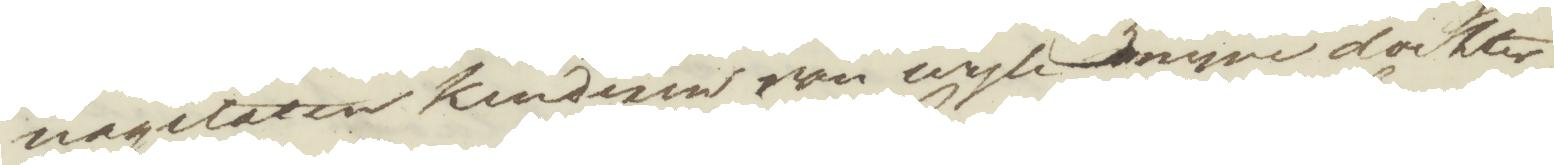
nagelaten kinderen van wyle myne dochter
